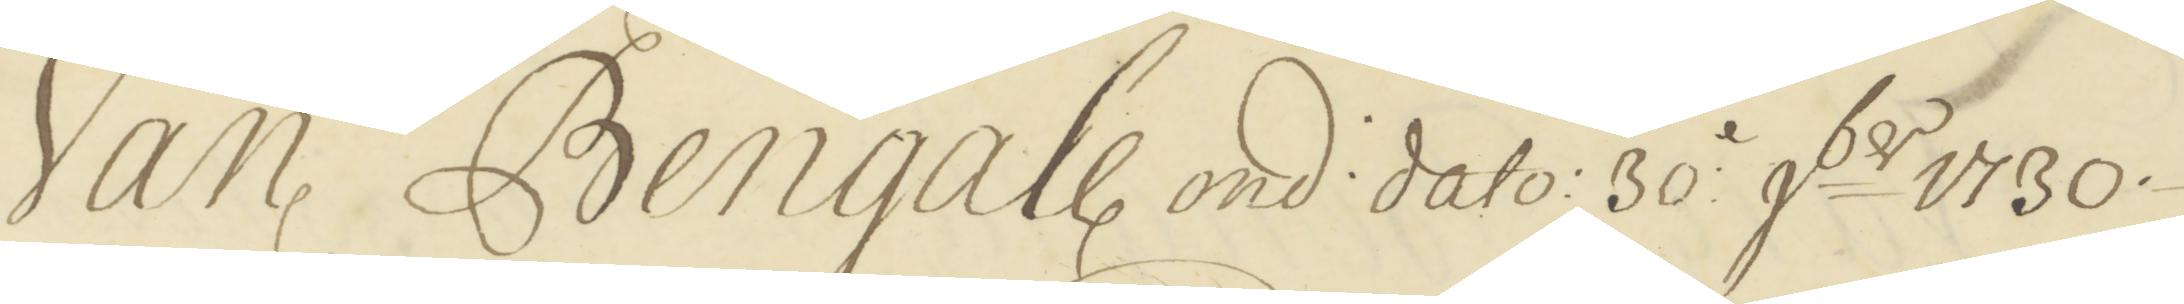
Van Bengale ond: dato: 30:e 9=ber 1730.
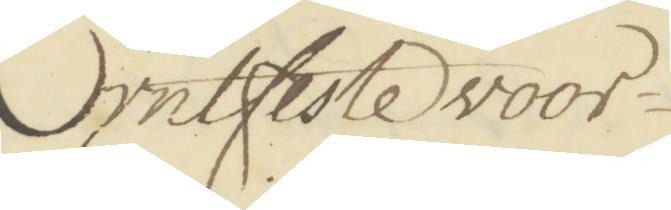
Erntfeste voor
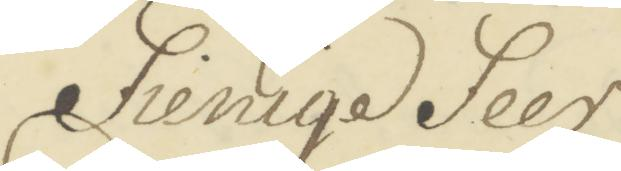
Sienige Seer
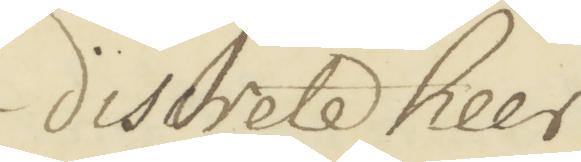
discrete heer
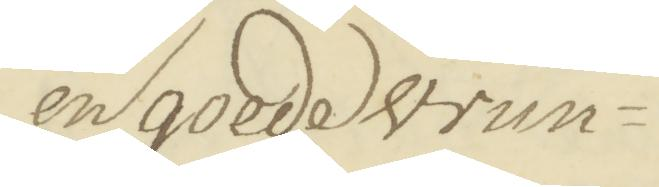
en goede vrun=
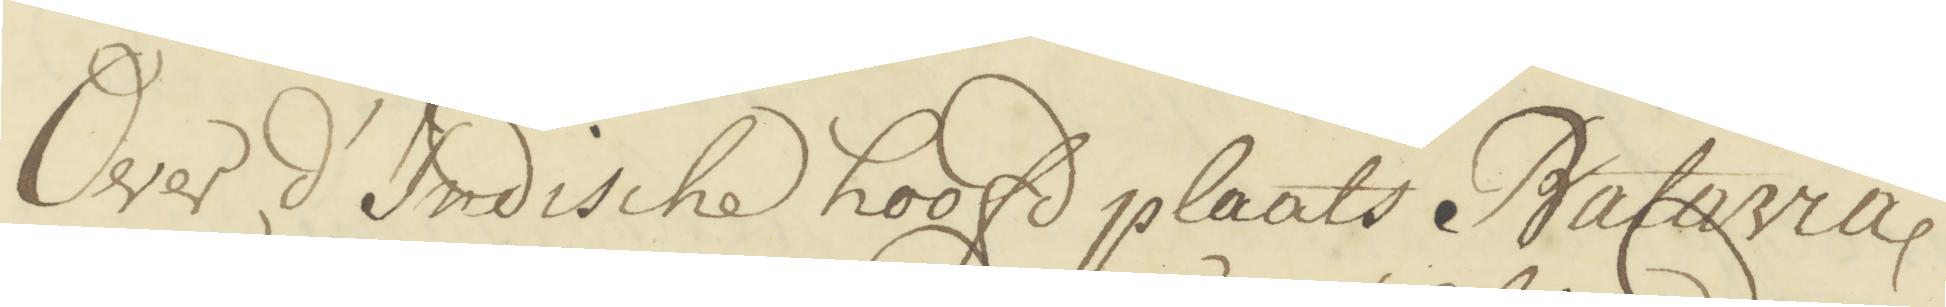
Over d’ Indische hoofd plaats Batavia,
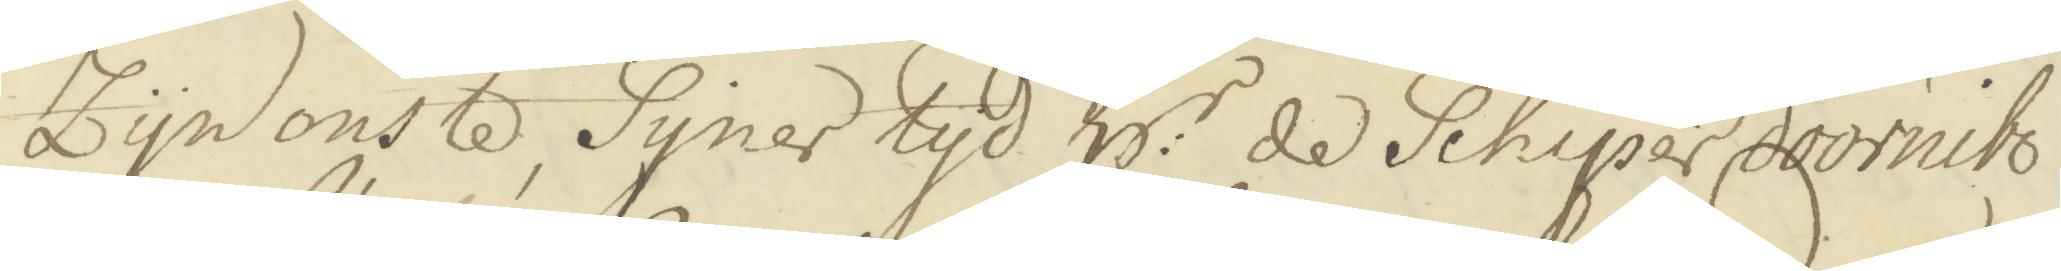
Zijn ons te Sijner tijd p:r de schiper doornik
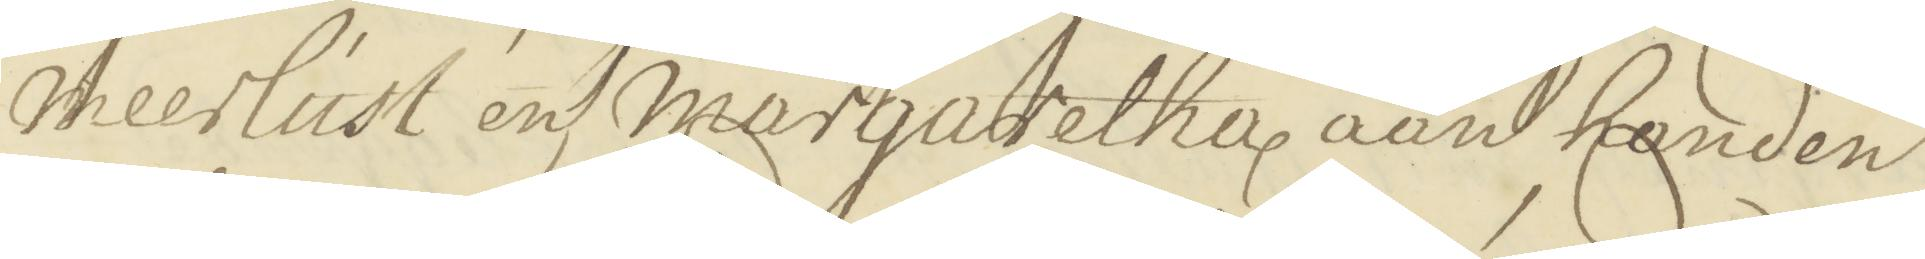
Meerlust en Margaretha aan handen
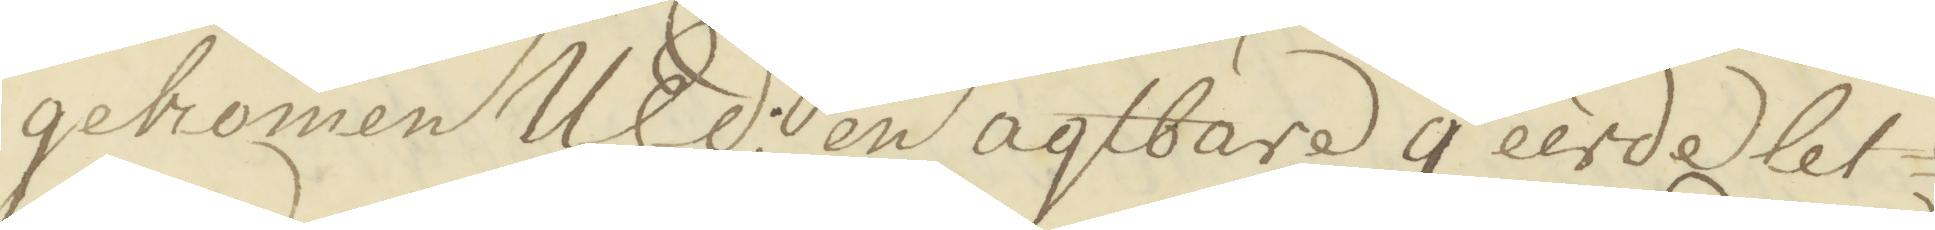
gekomen UEd: en agtbare g’eerde let„
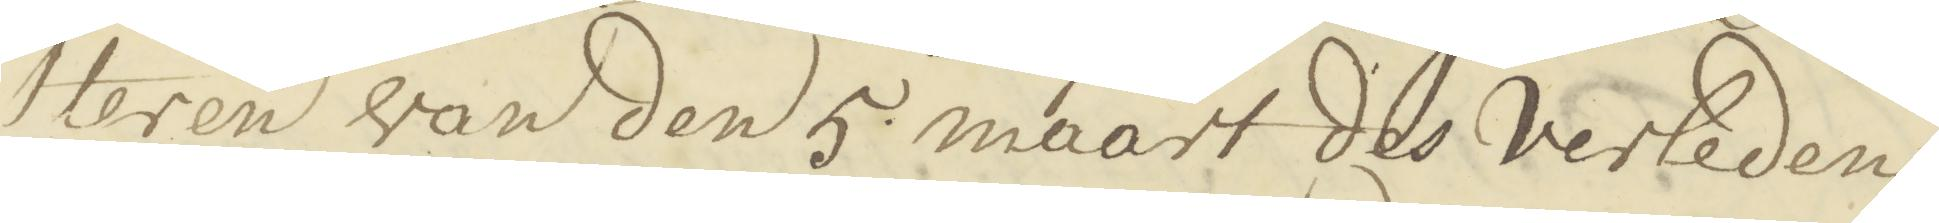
teren van den 5:' maart des verleden
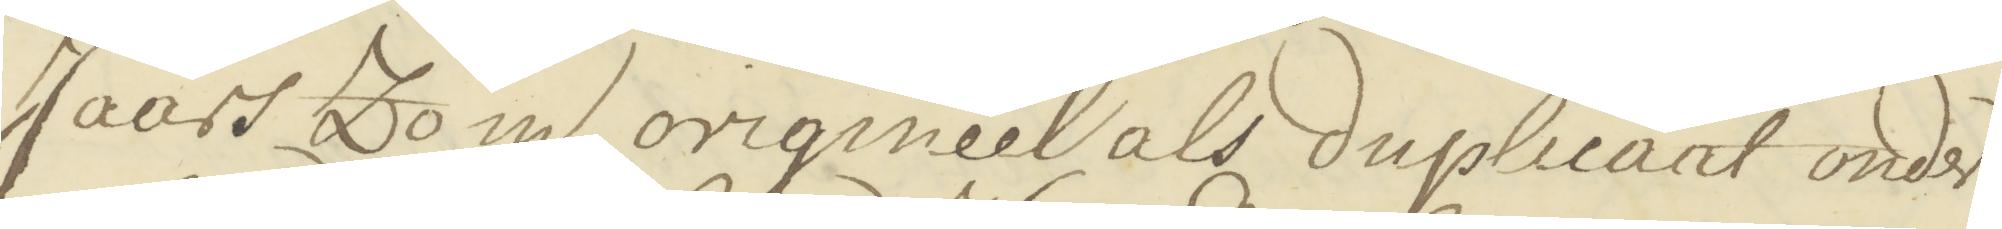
Jaars Zo in origineel als duplicaat onder
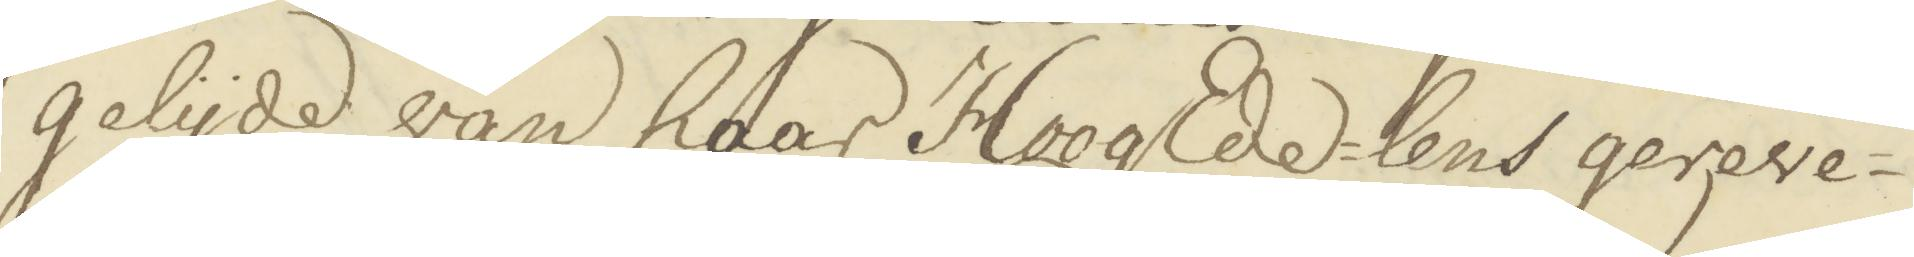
gelijde van haar Hoog Ede=lens gereve=
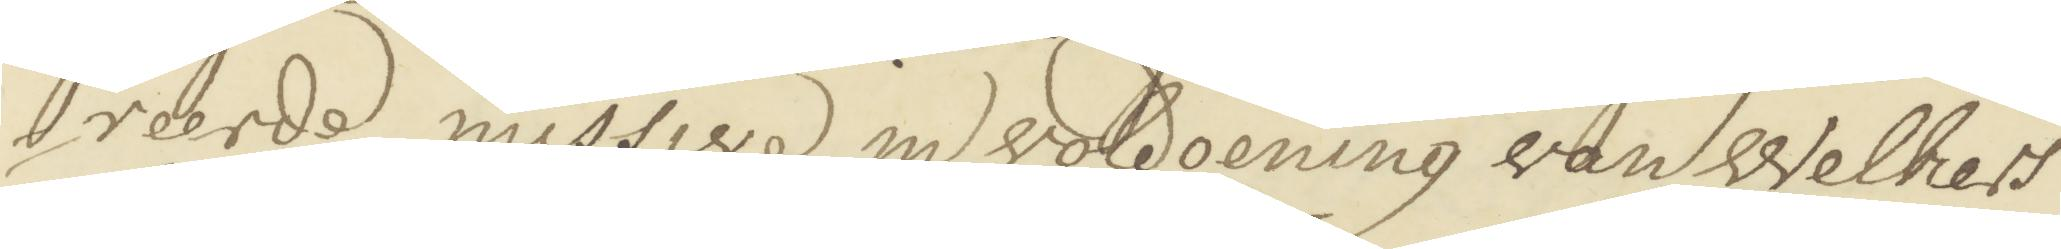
=reerde missive in voldoening van welkers
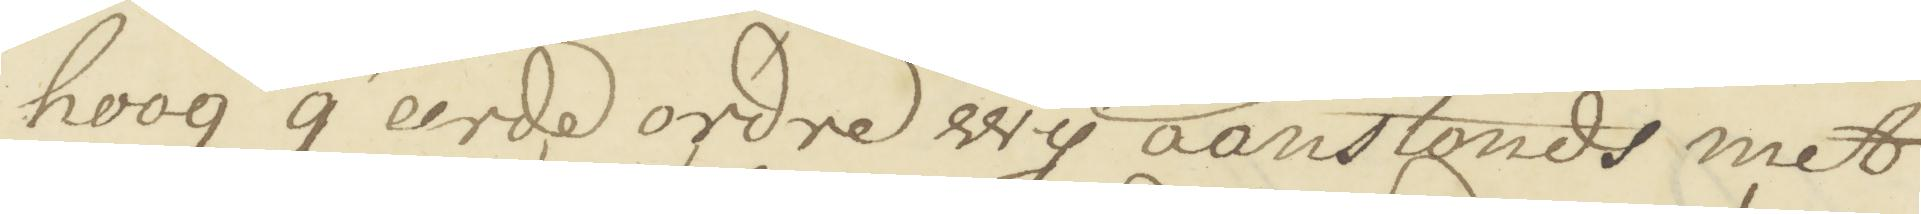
hoog g'eerde ordre wij aanstonds met
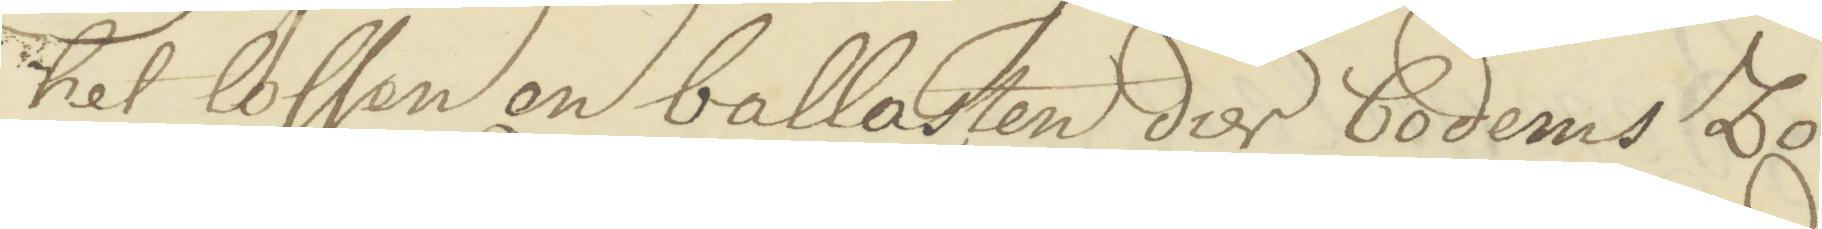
het lossen en ballasten dier bodems Zo
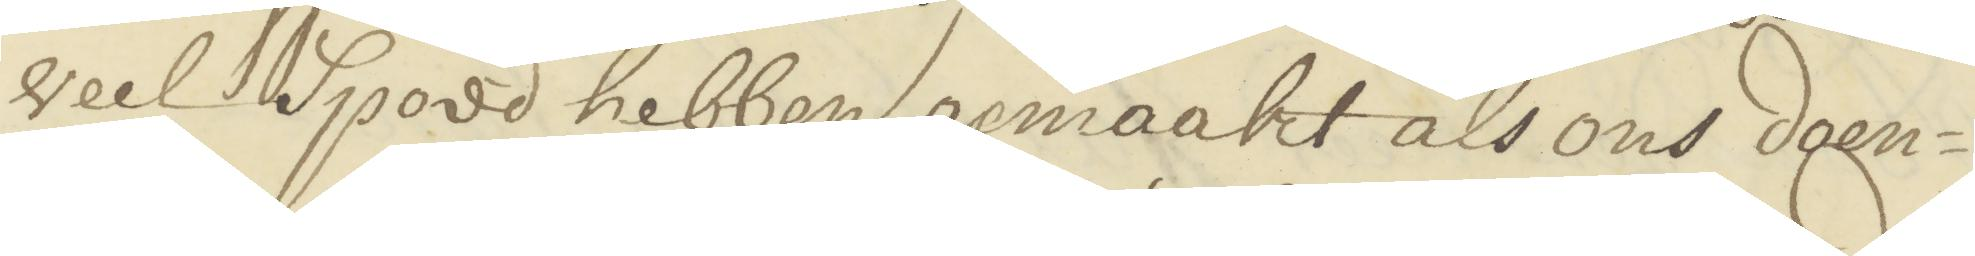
veel Spoed hebben gemaakt als ons doen=
